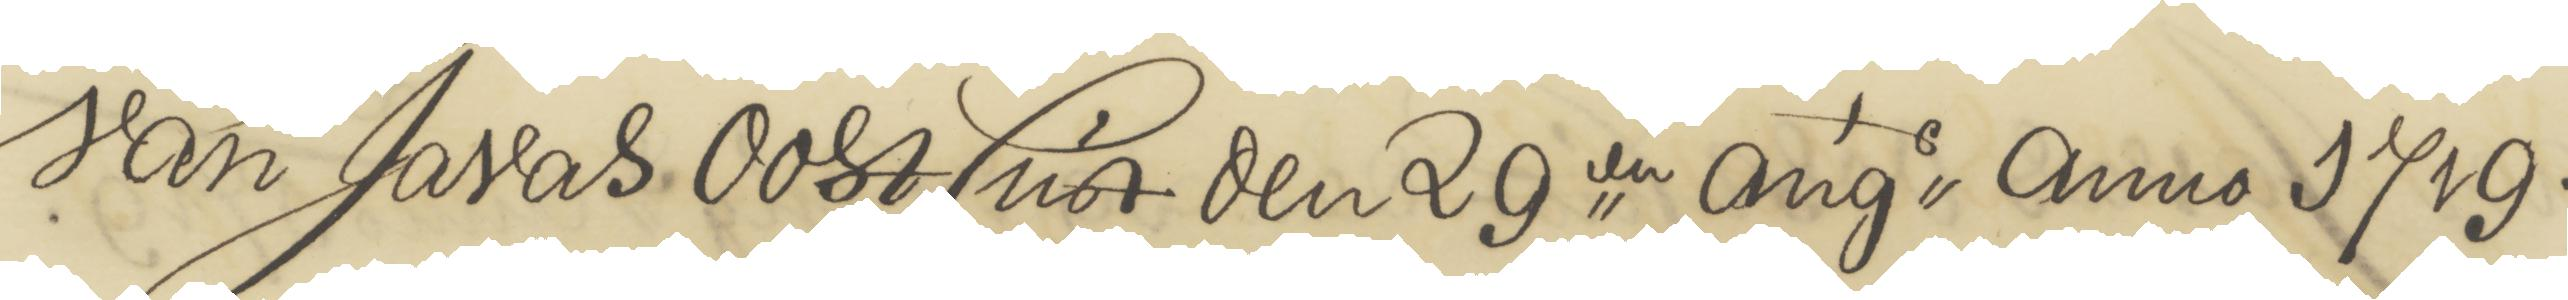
Van Javas Oost Cust den 29„en Aug„s Anno 1719.
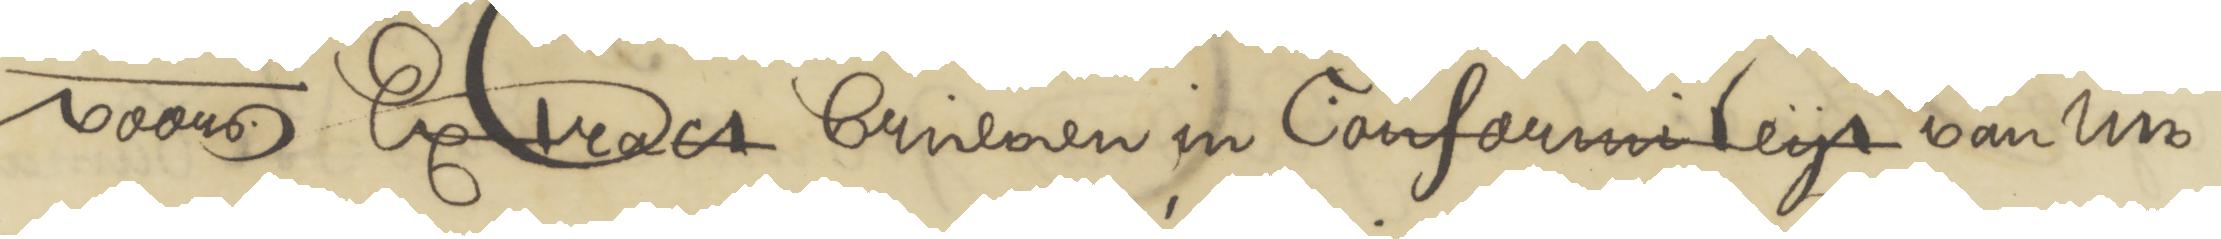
voors Extract brieven in Conformiteijt van Uw
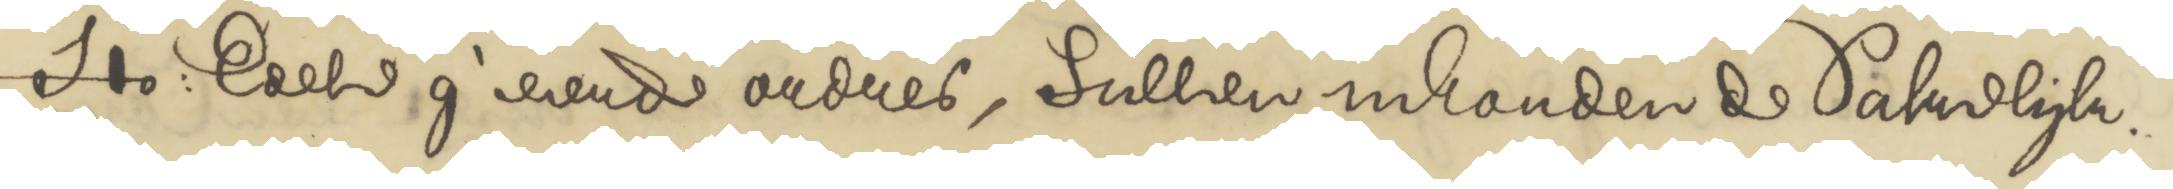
Ho: Edele g’eerde ordres, sullen inhouden de sakelijk„
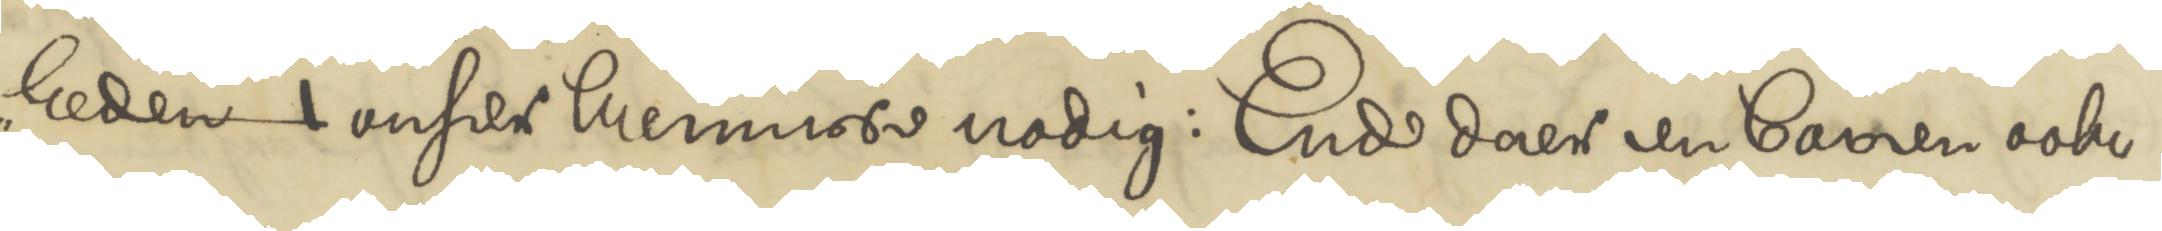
„heden 't onser kennisse nodig: Ende daer en boven ook
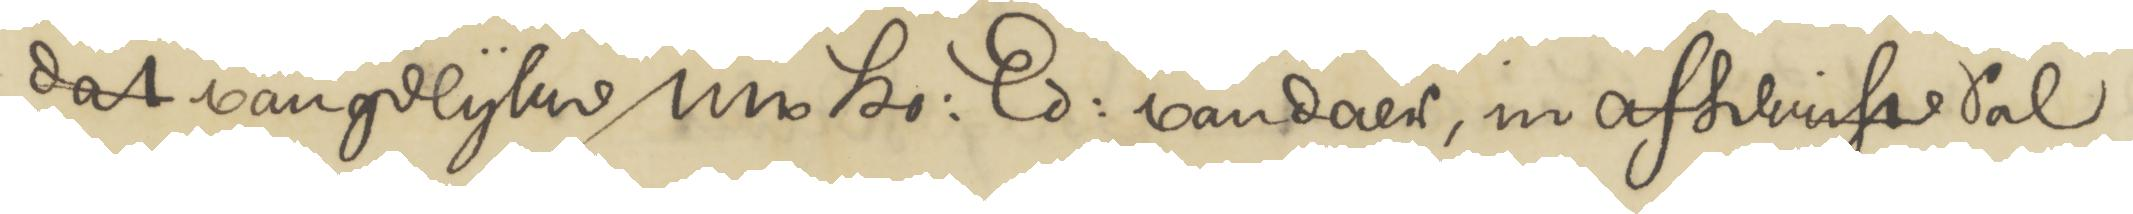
dat van gelijke uw ho: Ed: van daer, in afschrifte sal
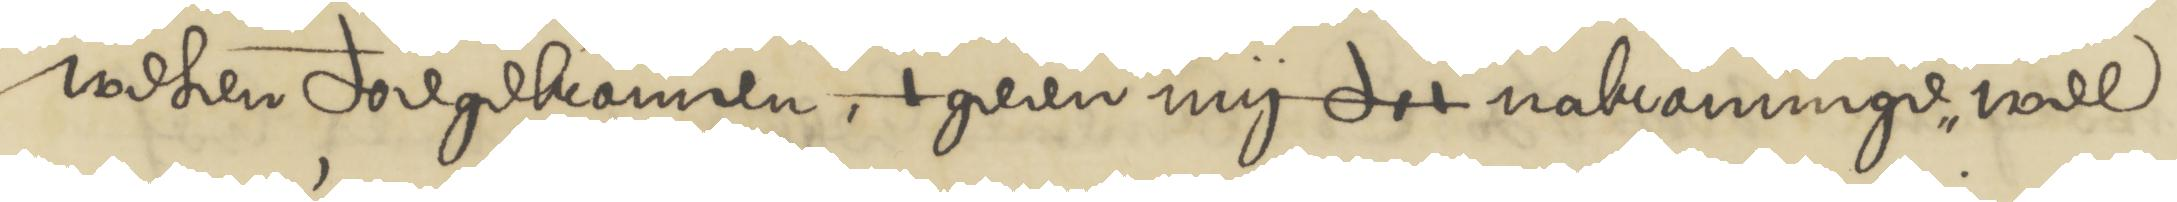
wesen toegekomen, 't geen mij tot nakominge „ wel
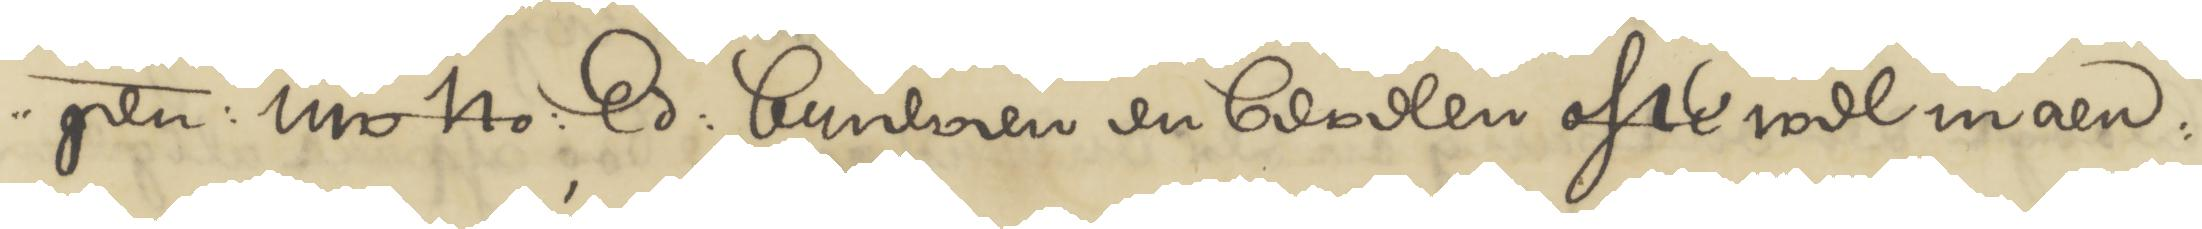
„gen: uw Ho: Ed: brieven en bevelen ofte wel in aen„
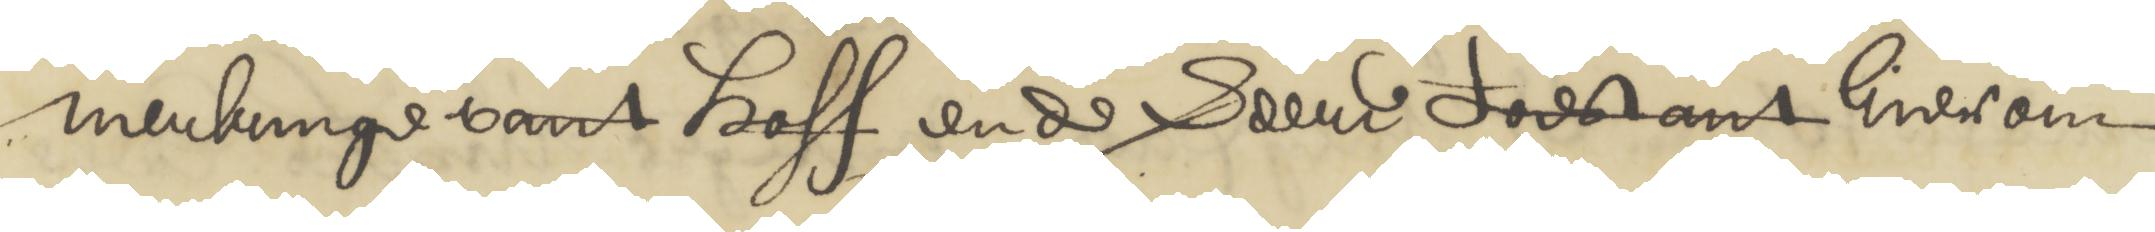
merkinge van't Hoff en de verdere toestant hier om
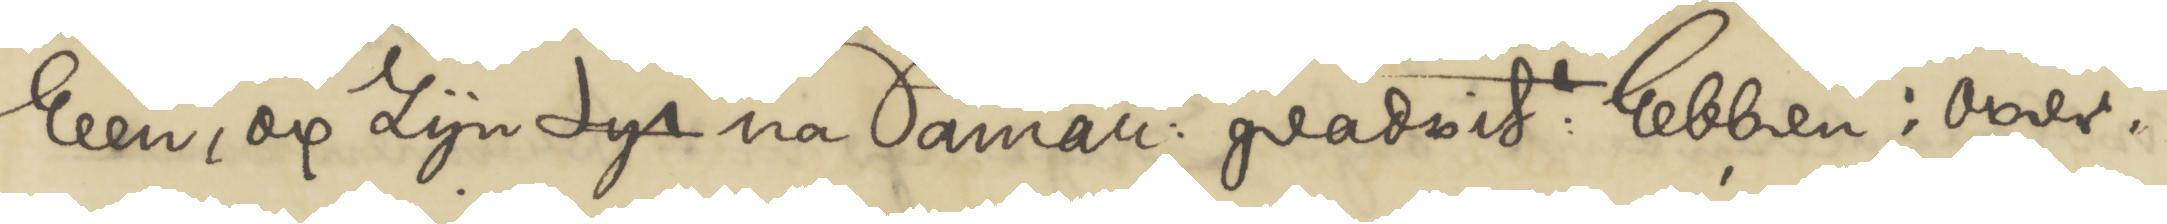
heen, op zijn tijt na Samar: geadvis:t hebben; over„
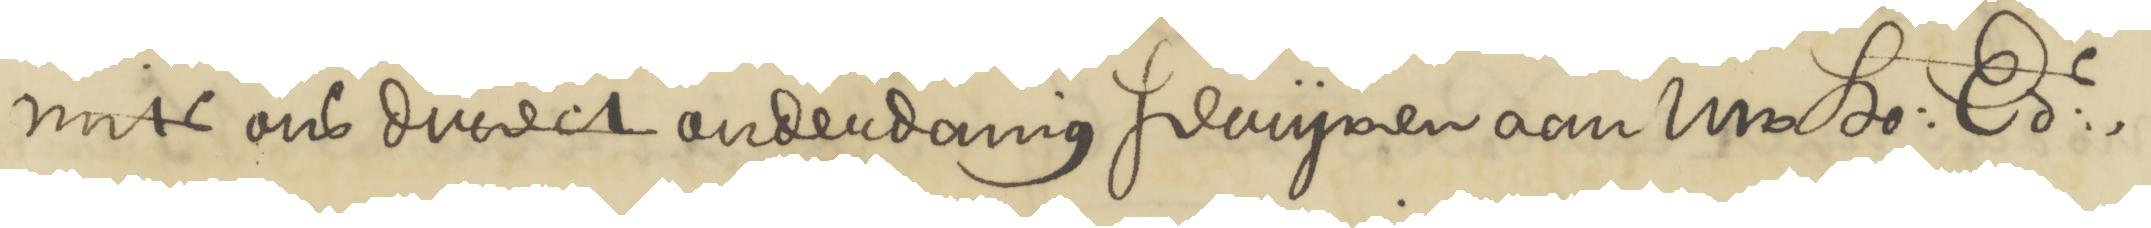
mits ons direct onderdanig schrijven aan Uw Ho: Ed:s,
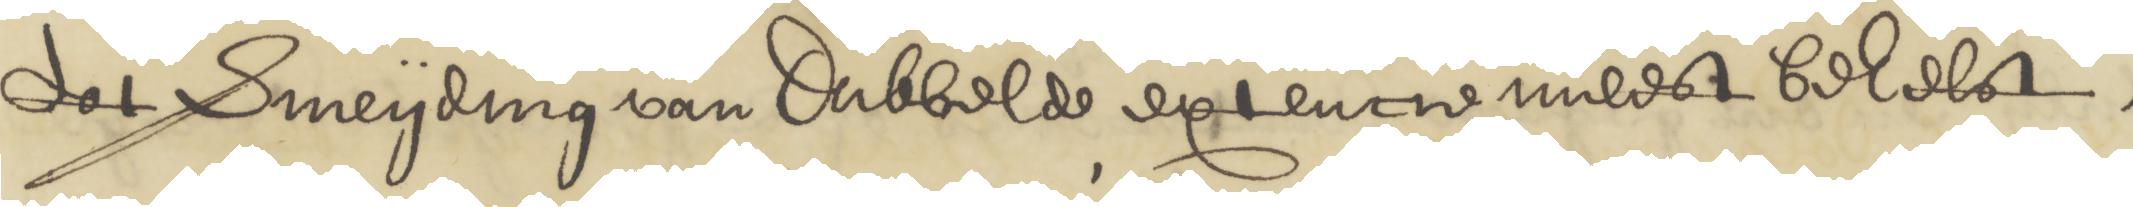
tot vermeijding van dubbelde extencie meest behelst,
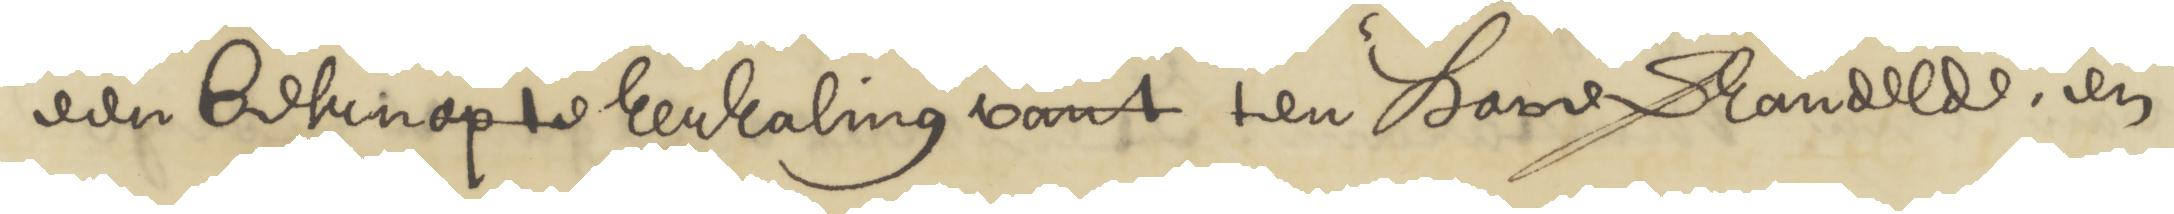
een beknopte herhaling van't ten Hove verhandelde, en
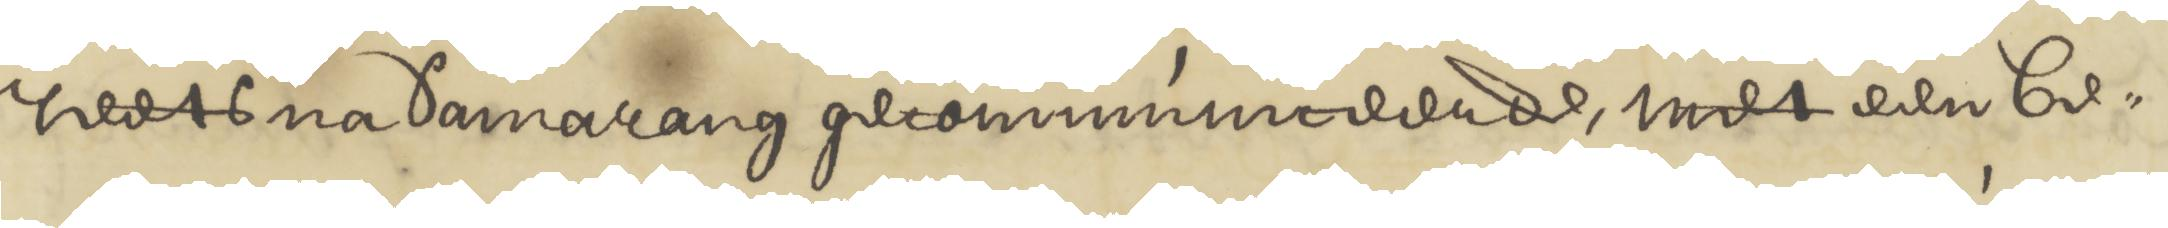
reets na samarang gecommuniceerde, met een be„
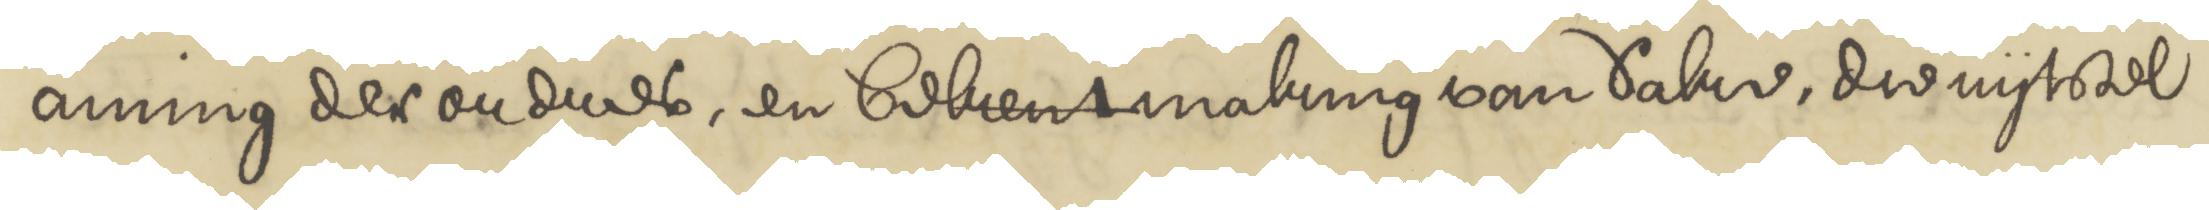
aming der ordres, en bekentmaking van sake, die uijtstel
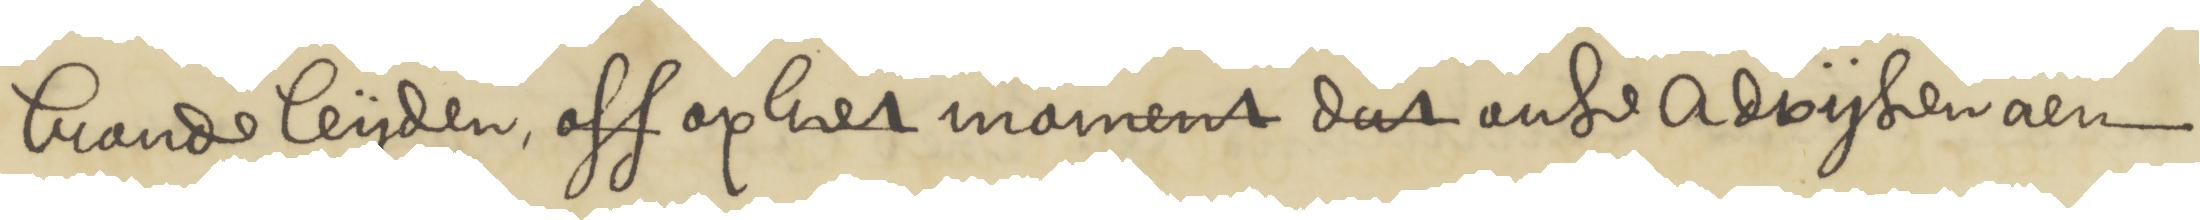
konde leijden, off op het moment dat onse advijsen aen
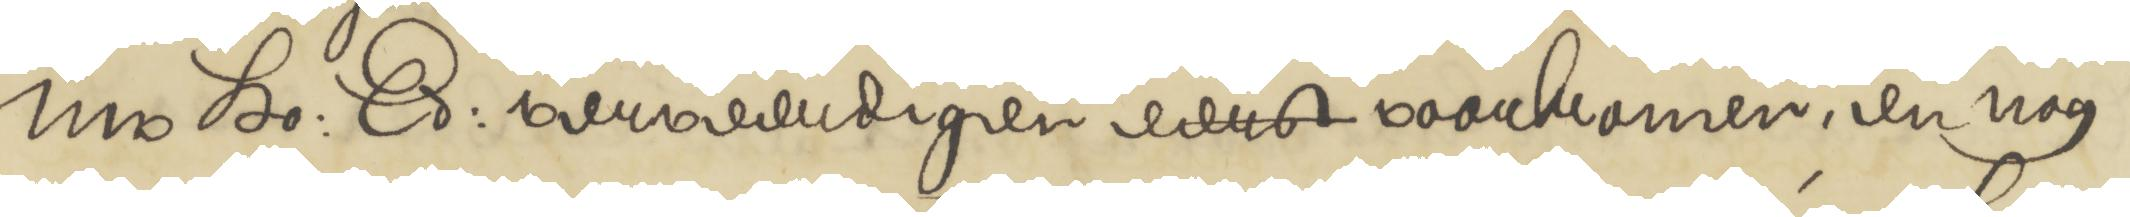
Uw Ho: Ed: verveerdigen eerst voorkomen, en nog
